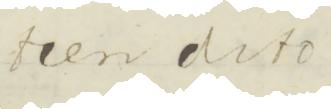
tien dito
